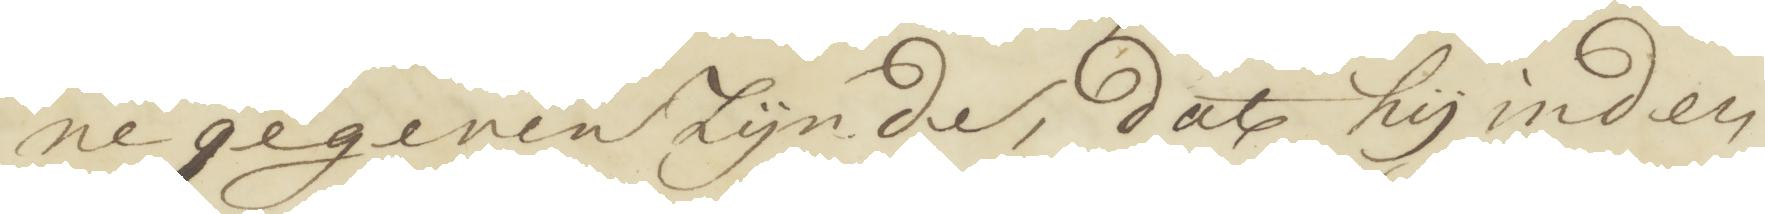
ne gegeven zijnde, dat hij inden
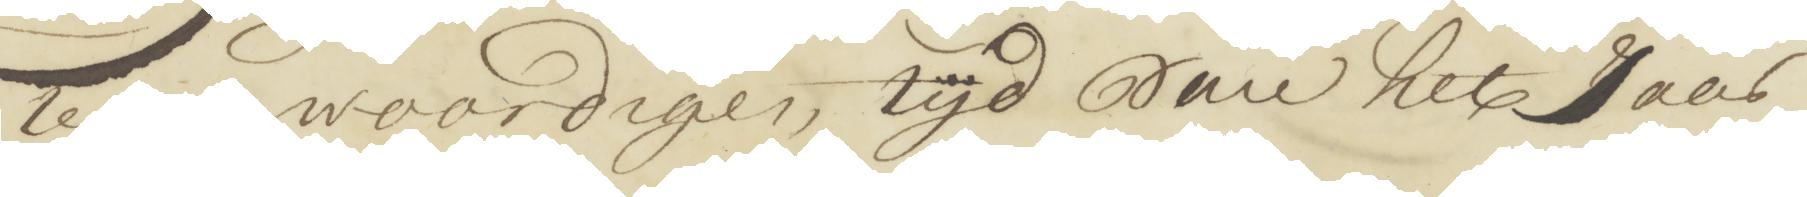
tegenwoordigen tijd van het Jaar
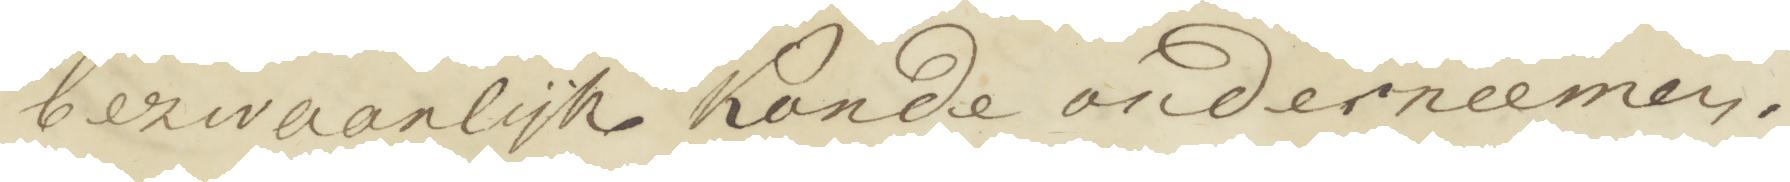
bezwaarlijk konde onderneemen,
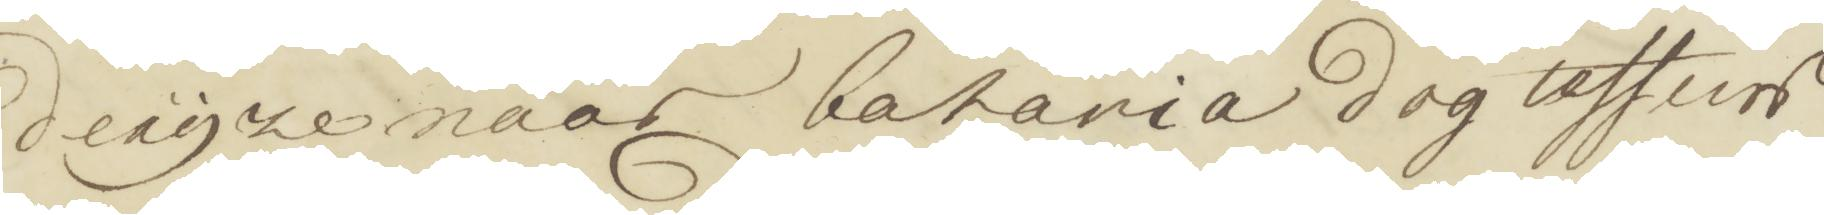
de rijze naar batavia dog teffens
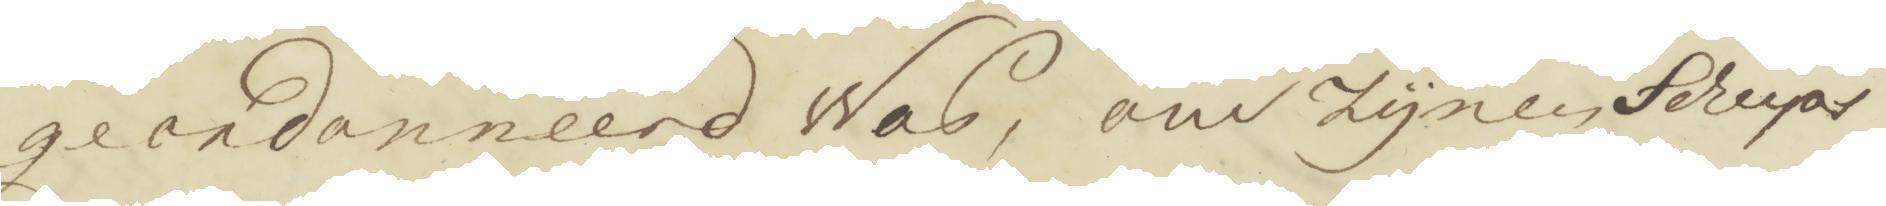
geordonneerd was, om zijnen scheeps
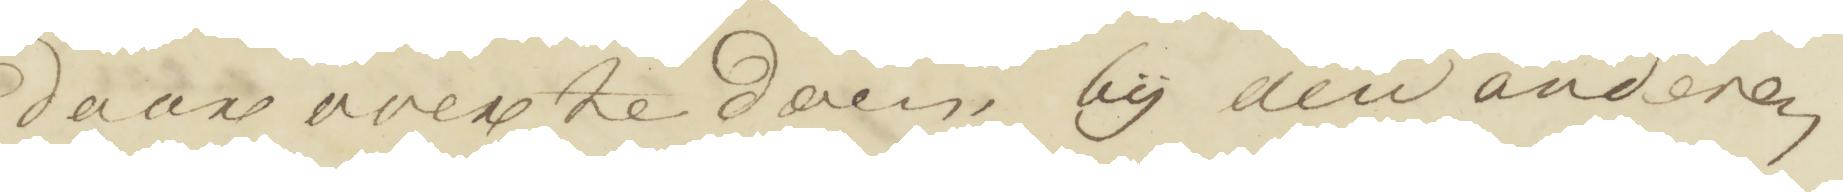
daar over te doen, bij den anderen
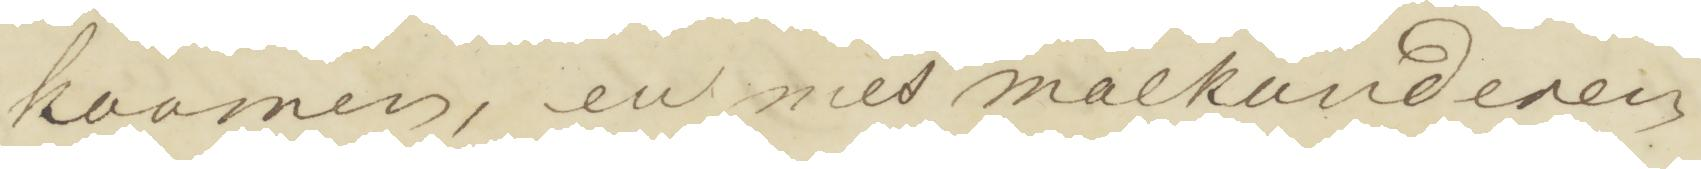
koomen, en met malkanderen
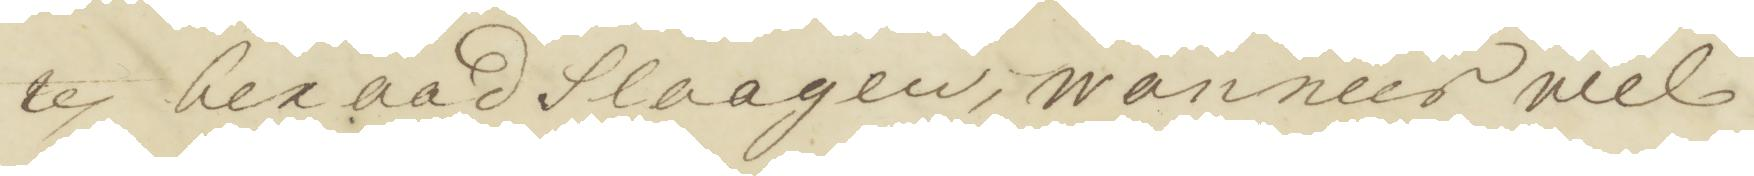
te beraadslaagen, wanneer wel
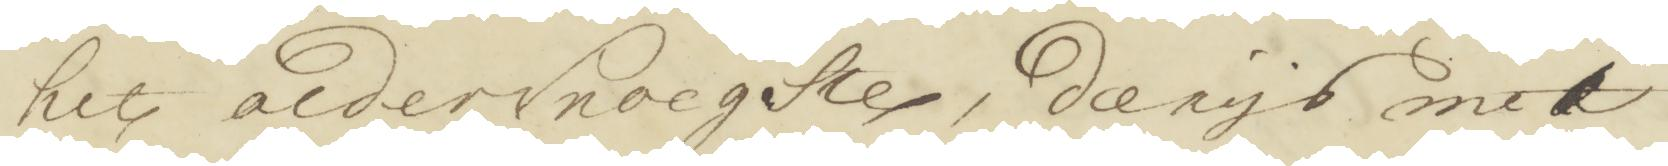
het aldervroegste, de rijs met
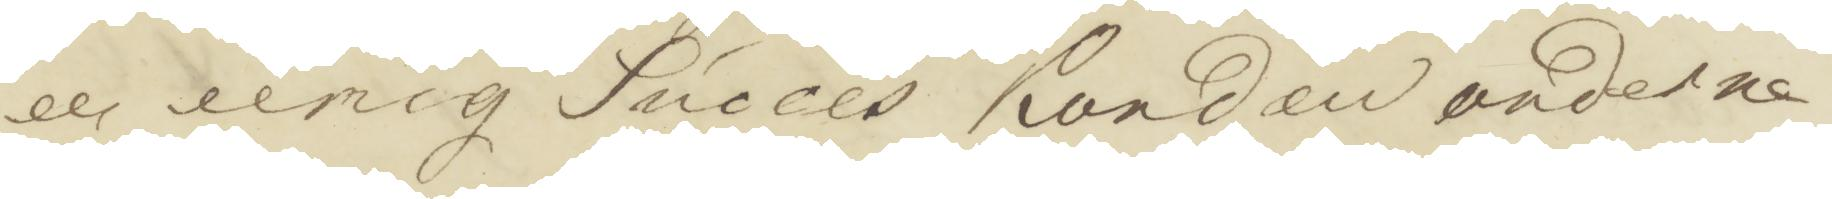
een eenig succes konden onderne
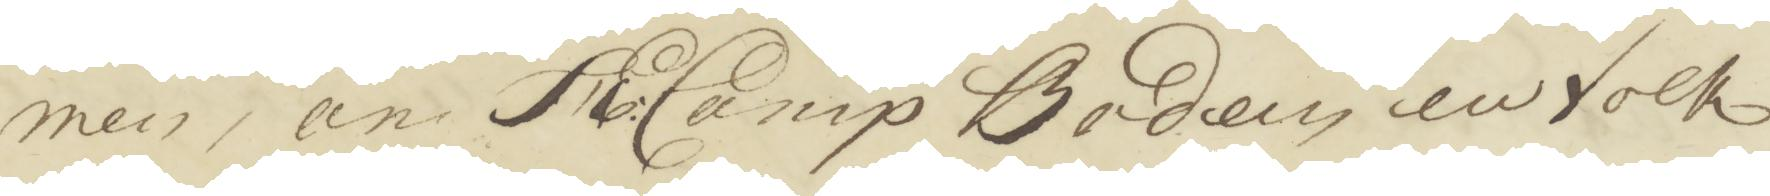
men, en s'E:Comp Bodem en volk
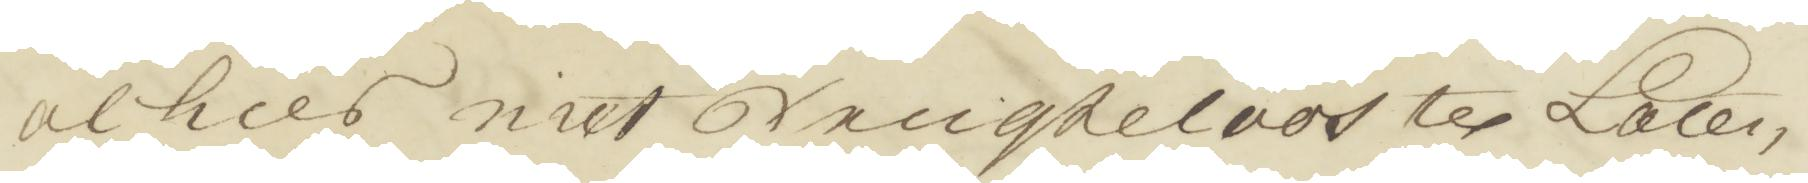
alhier niet vrugteloos te laten
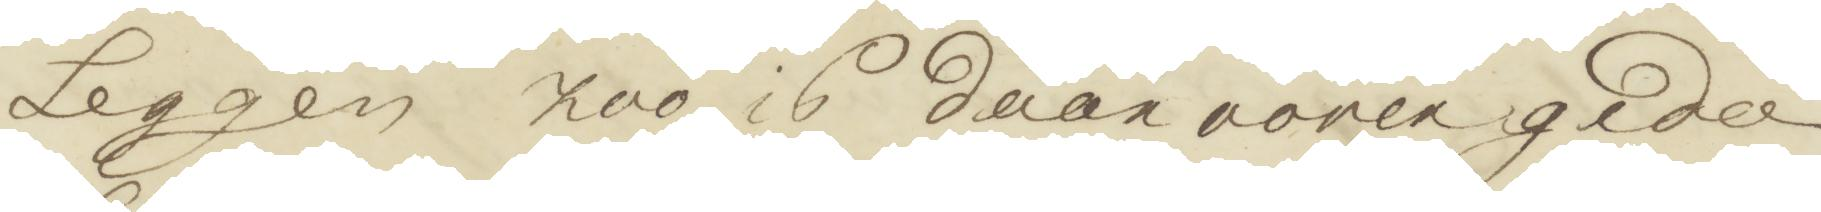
leggen zoo is daar oover gedee
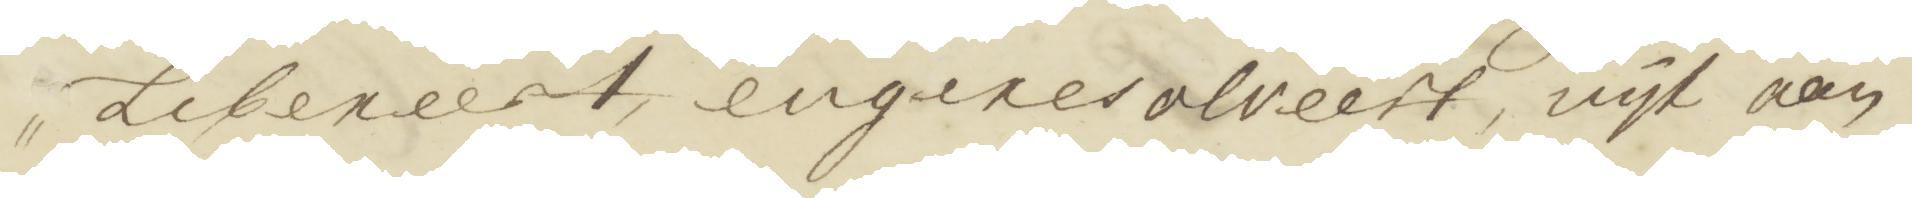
„libereert, en geresolveert, uijt aan
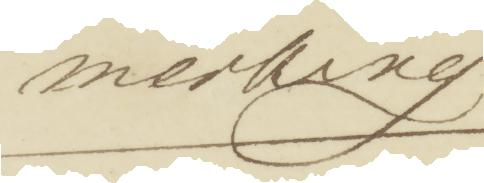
merking
